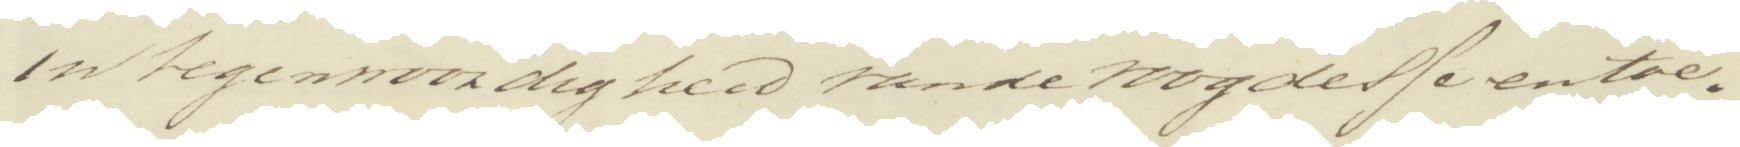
in tegenwoordigheid van de voogdesse en toe„
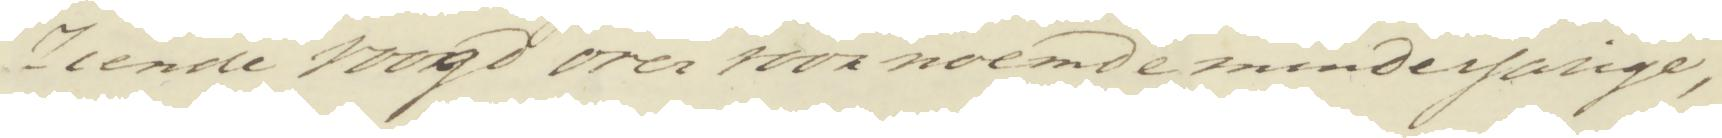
ziende voogd over voornoemde minderjarige,
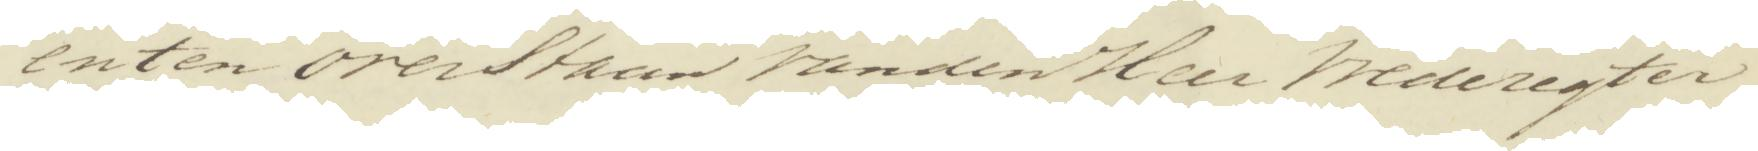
en ten overstaan van den Heer Vrederegter
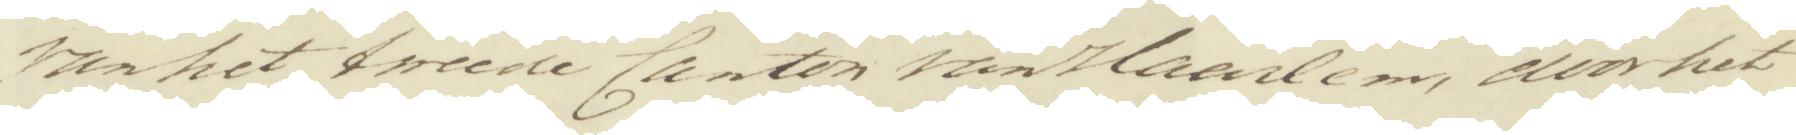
van het tweede Canton van Haarlem, door het
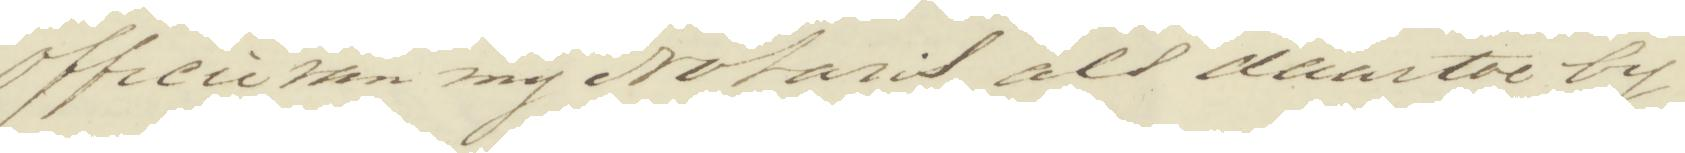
Officie van my Notaris als daartoe by
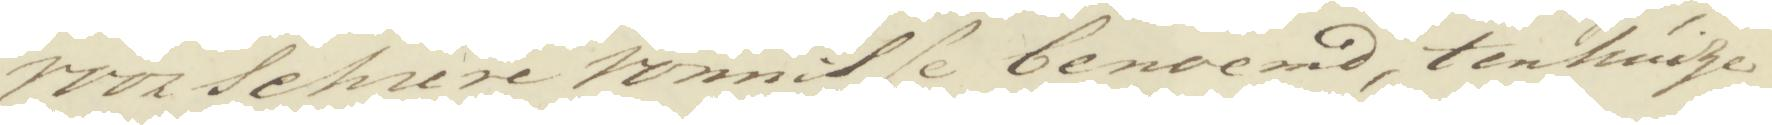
voorschreve vonnisse benoemd, ten huize
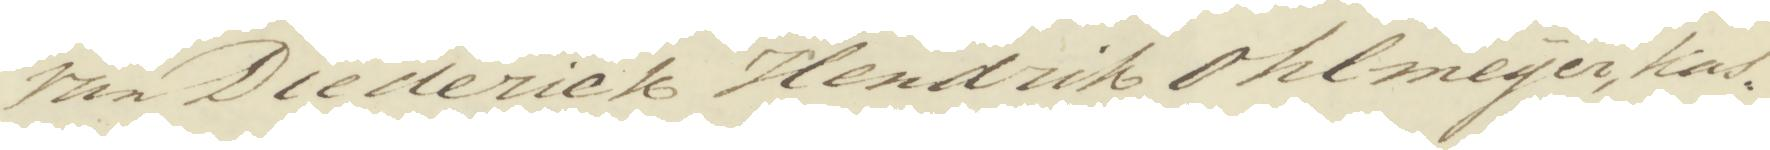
van Diederick Hendrik Ohlmeijer, kas„
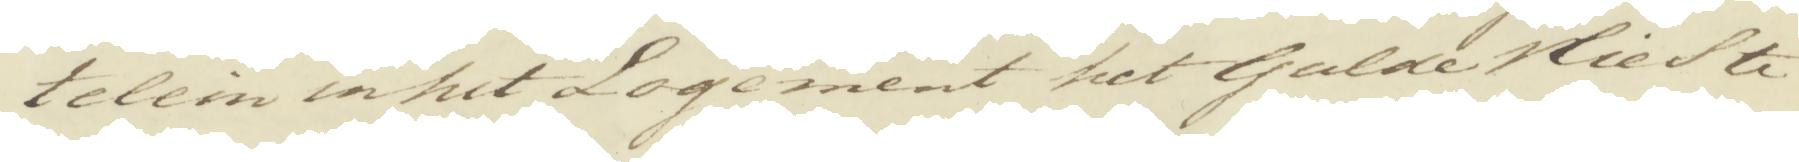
telein in het Logement het Gulde Vlies te
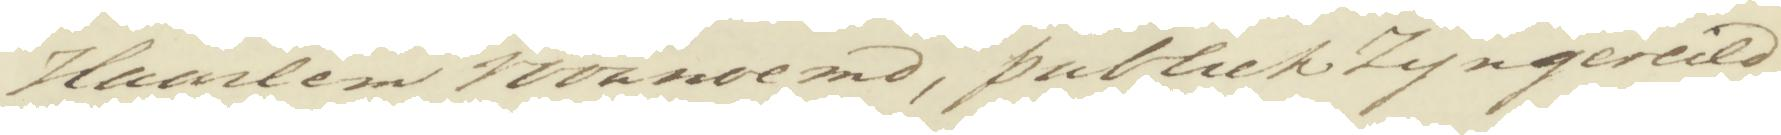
Haarlem voornoemd, publiek zyn geveild
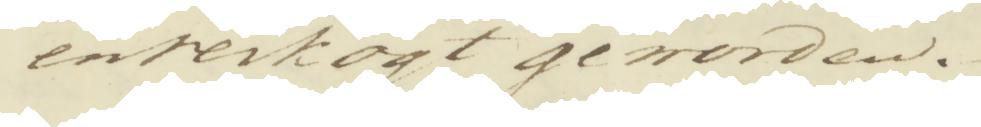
en verkogt geworden.
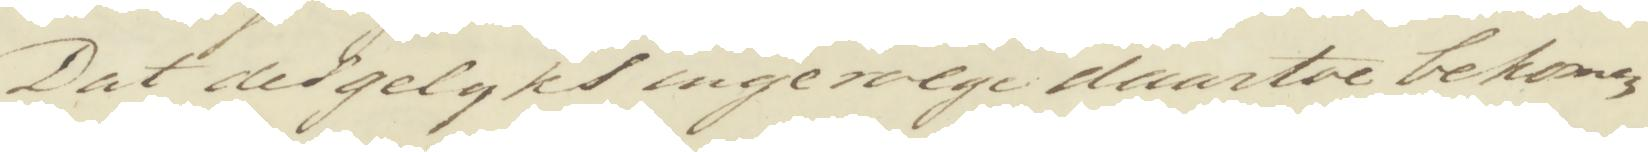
Dat desgelyks ingevolge daartoe bekomen
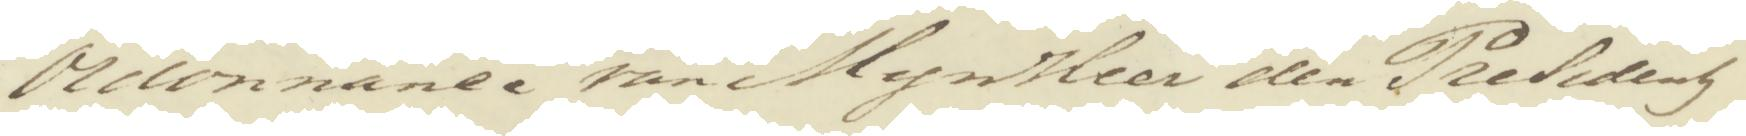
Ordonnance van Myn Heer den President
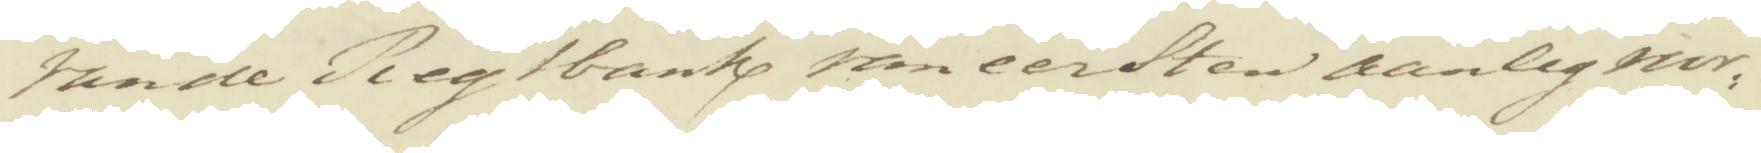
van de Regtbank van eersten aanleg voor„
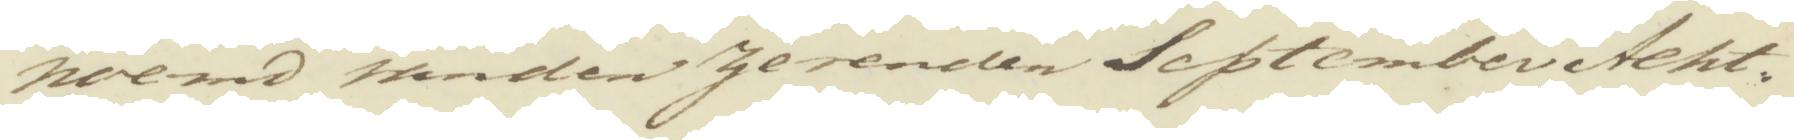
noemd van den Zevenden September Acht„
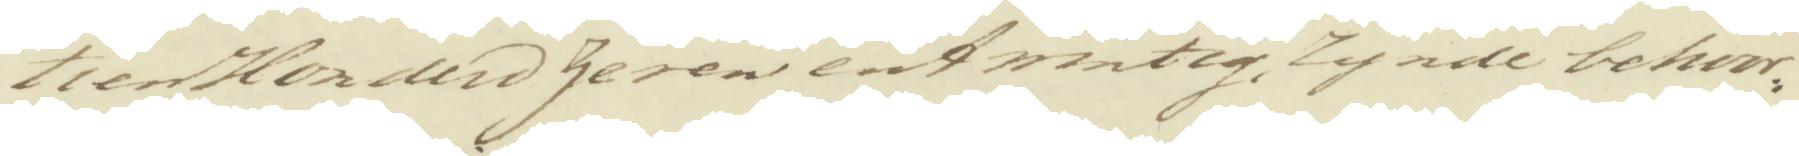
tien Honderd Zeven entwintig, zynde behoor„
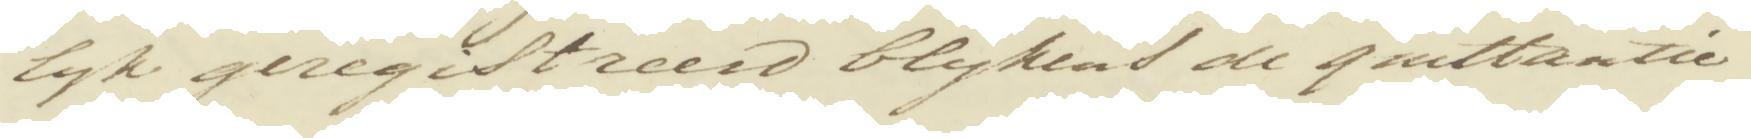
lyk geregistreerd blykens de quittantie
